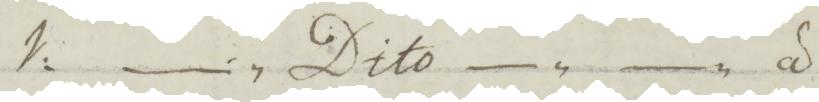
1: —„ Dito —„ —„ a
